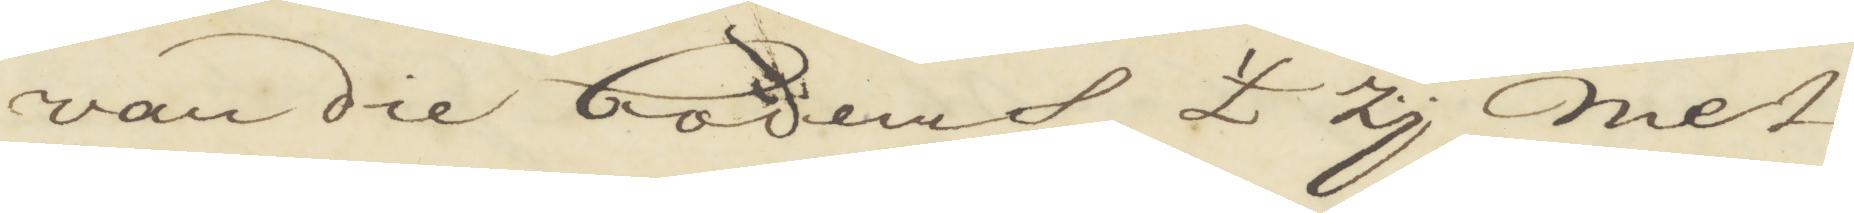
van die bodems 't Zij met
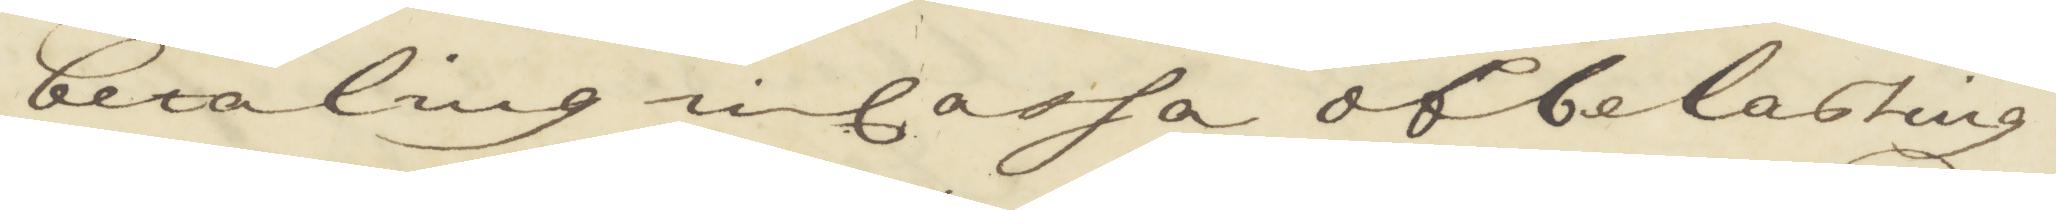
betaling in cassa of belasting
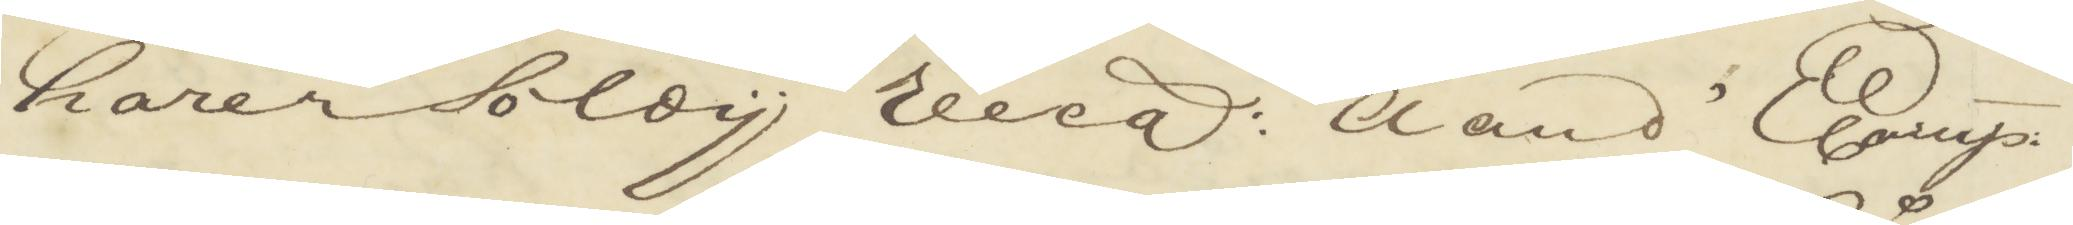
harer Soldij reecq: Aan d' EComp:
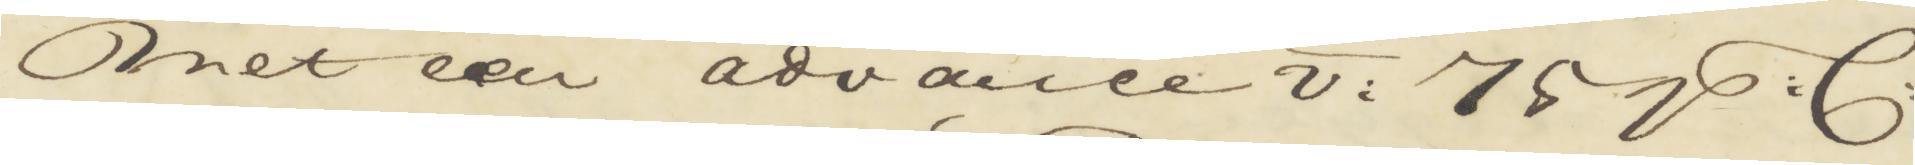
met een advance v: 75 p: C=o
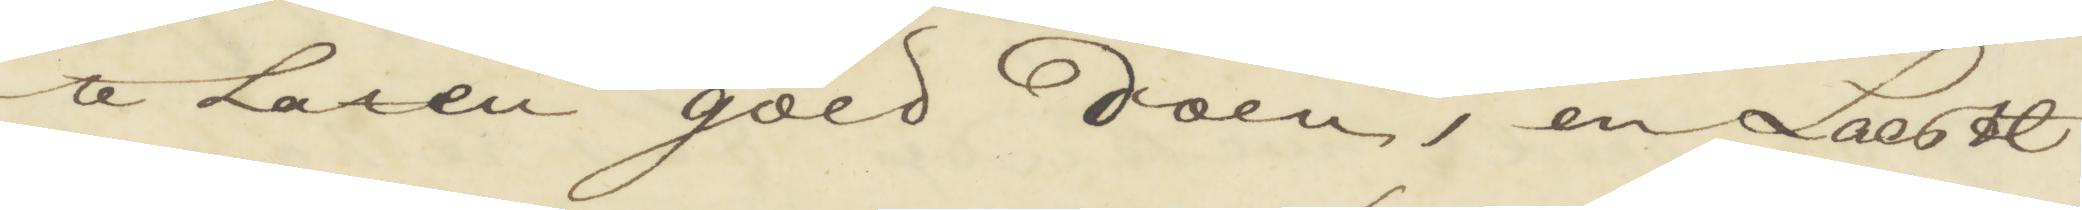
te Laten goed doen, en Laeste
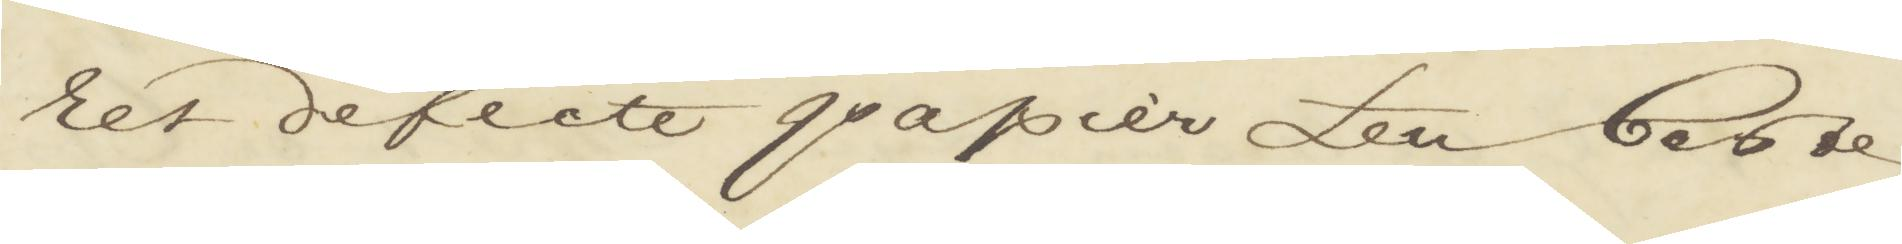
het defecte papier ten beste
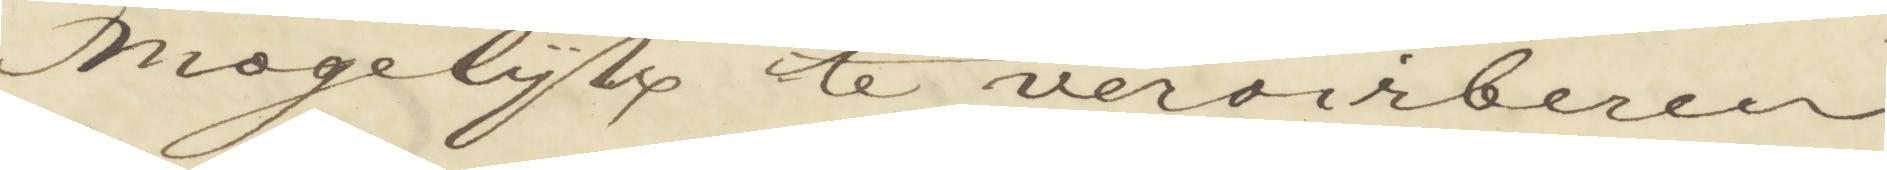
Mogelijk te veroirberen
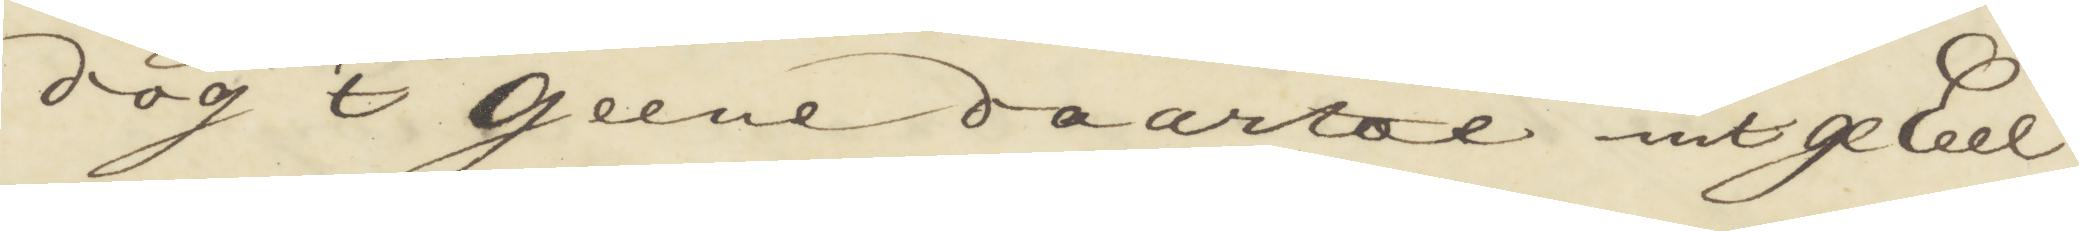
dog ’t geene daartoe int geheel
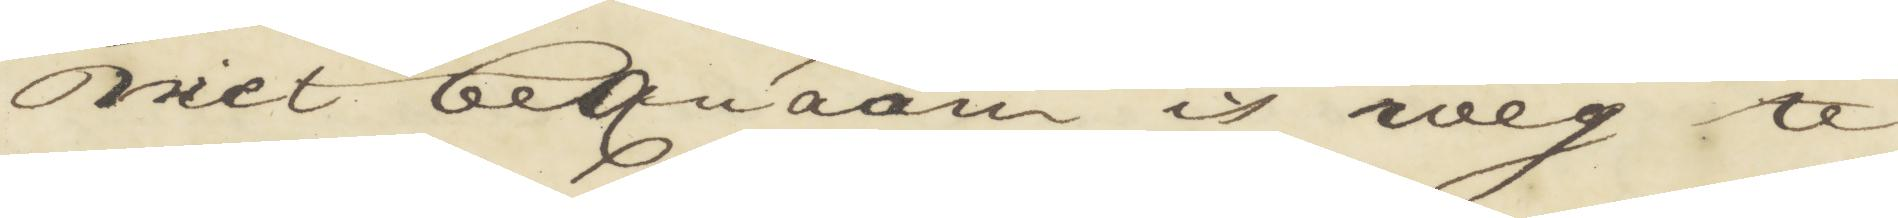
niet bequaam is weg te
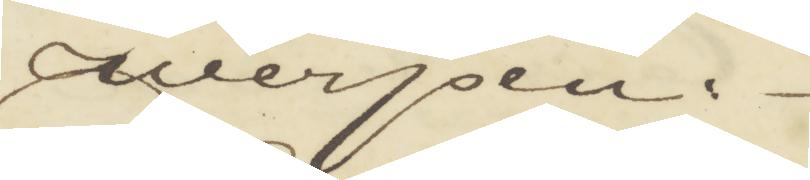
werpen:
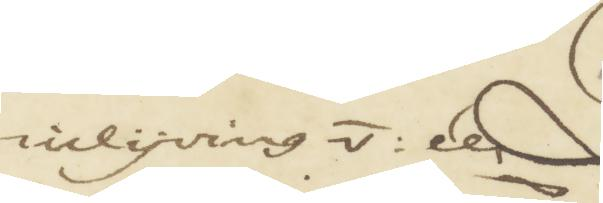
inlijving v: een
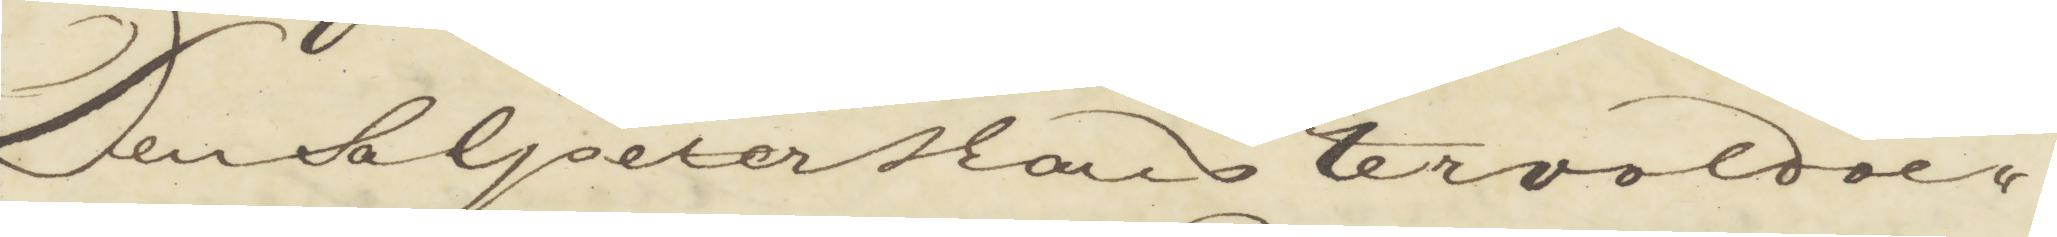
Den Salpeter thans ter voldoe„
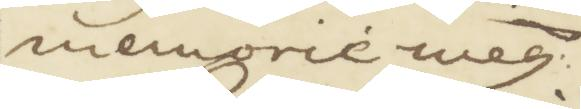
memorie weg:s
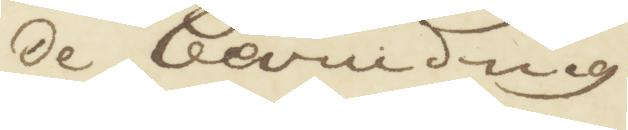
de bevinding
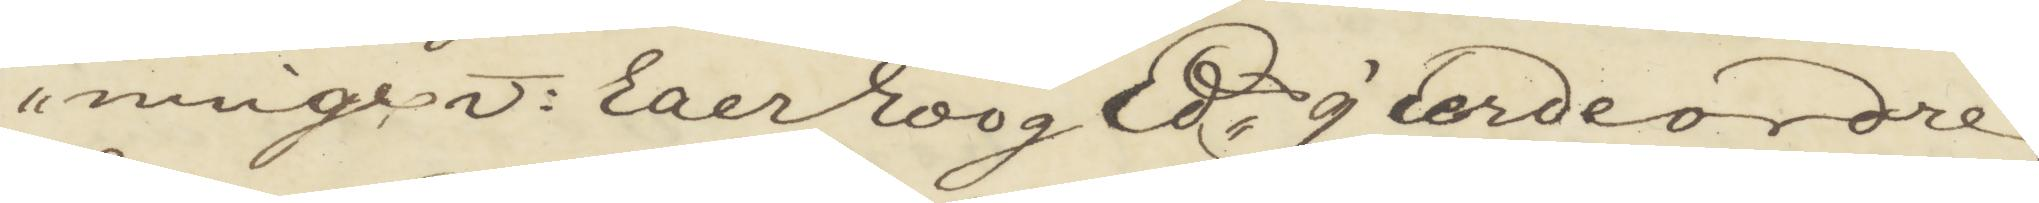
„ninge v: haer hoog Ed„s g’Eerde ordre
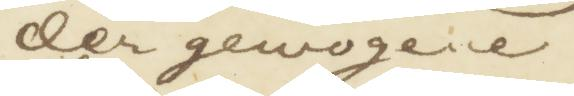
der gewogene
